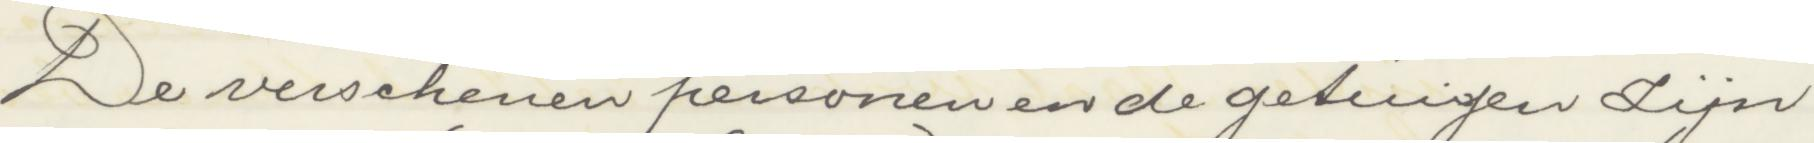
De verschenen personen en de getuigen zijn
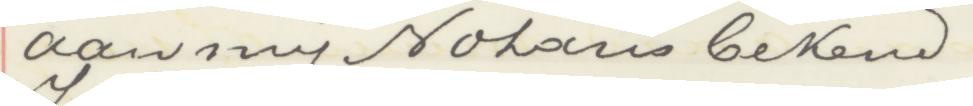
aan mij Notaris bekend
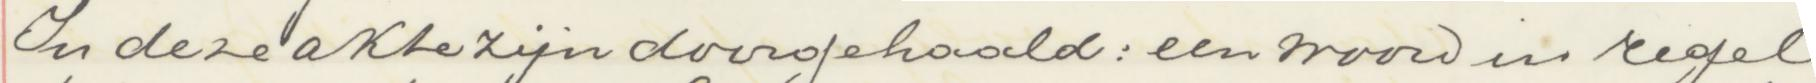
In deze akte zijn doorgehaald: een woord in regel
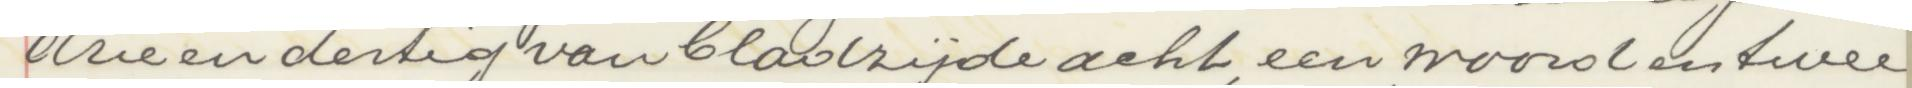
drie en dertig van bladzijde acht, een woord en twee
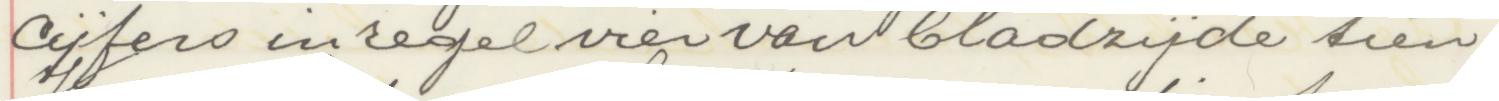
cijfers in regel vier van bladzijde tien
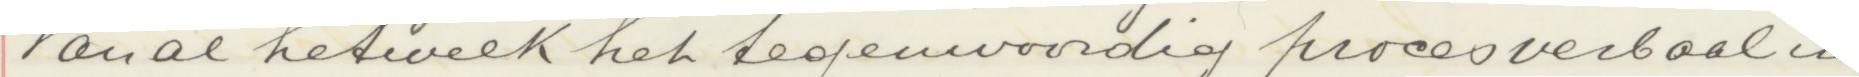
van al hetwelk het tegenwoordig proces verbaal in
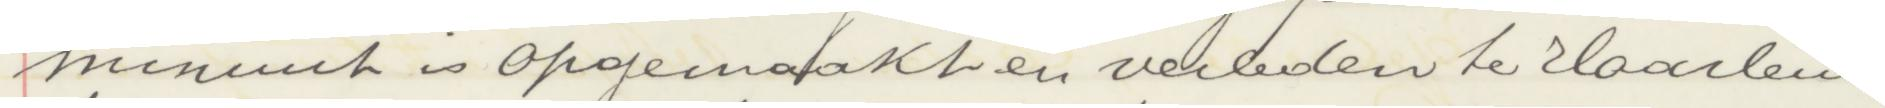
minuut is opgemaakt en verleden te Haarlem
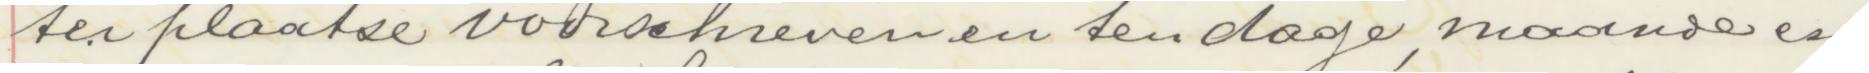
ter plaatse voorschreven en ten dage, maande en
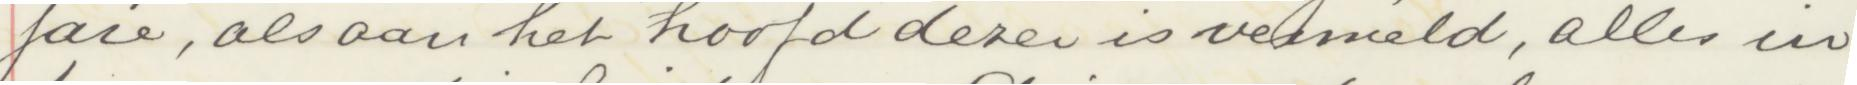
jare, als aan het hoofd dezes is vermeld, alles in
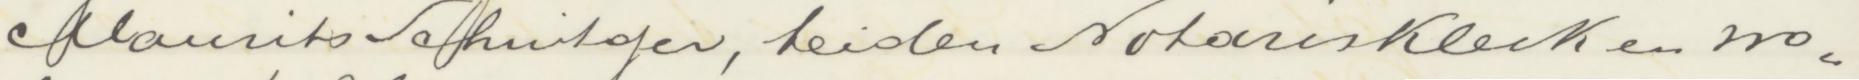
Maurits Schnitger, beiden Notarisklerk en wo„
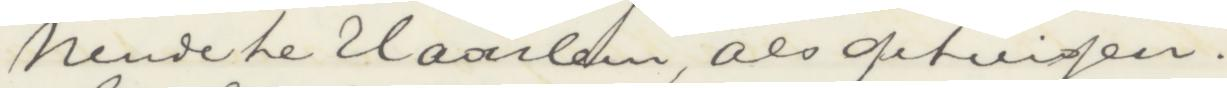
nende te Haarlem, als getuigen.
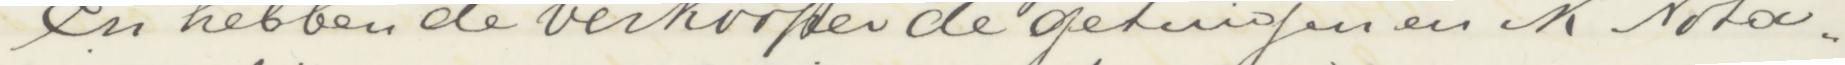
En hebben de verkooper de getuigen en ik Nota„
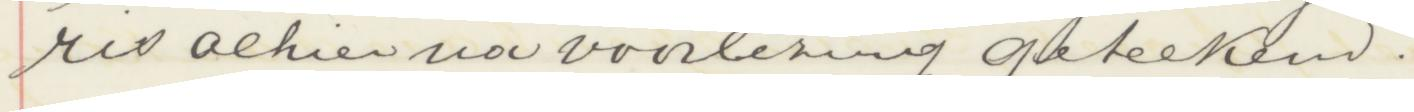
ris alhier na voorlezing geteekend.
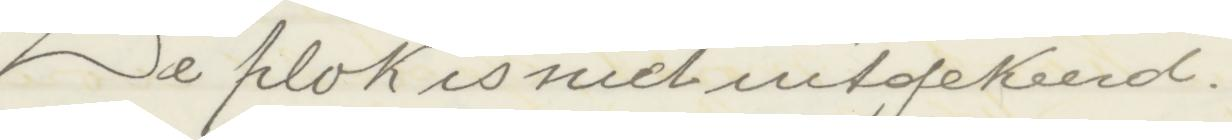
De plok is niet uitgekeerd.
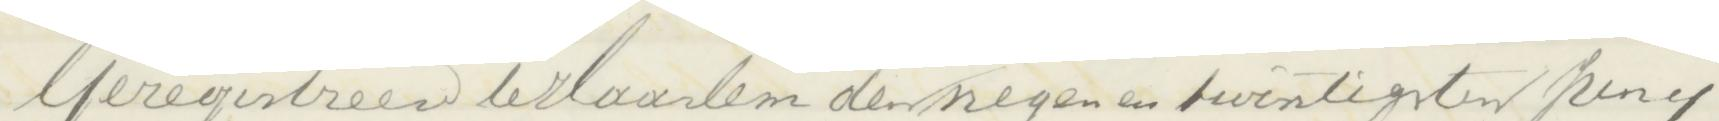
Geregistreerd te Haarlem den negen en twintigsten Juny
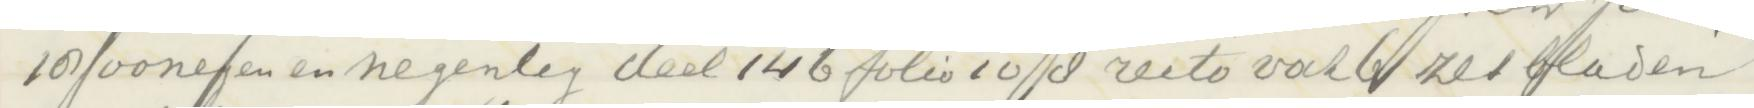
1800negen en negentig deel 146 folio 10 8 recto vak 6 zes bladen
